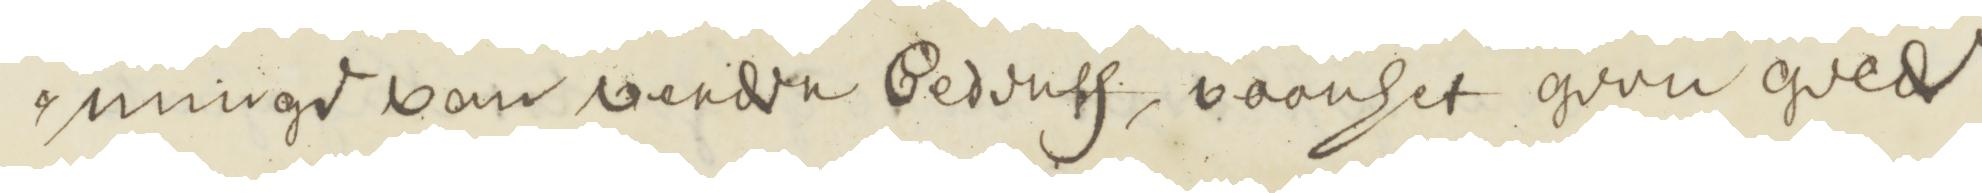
„minge van verder bederff, voor het geen gelde
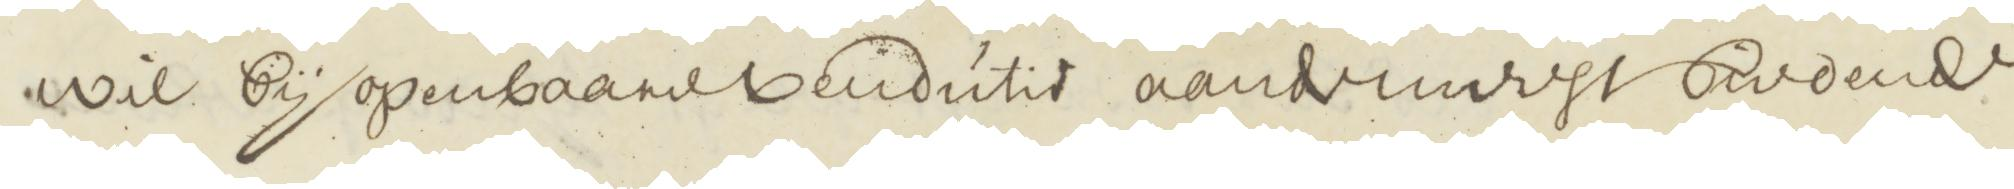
wil bij openbaare vendutie aande meest biedende
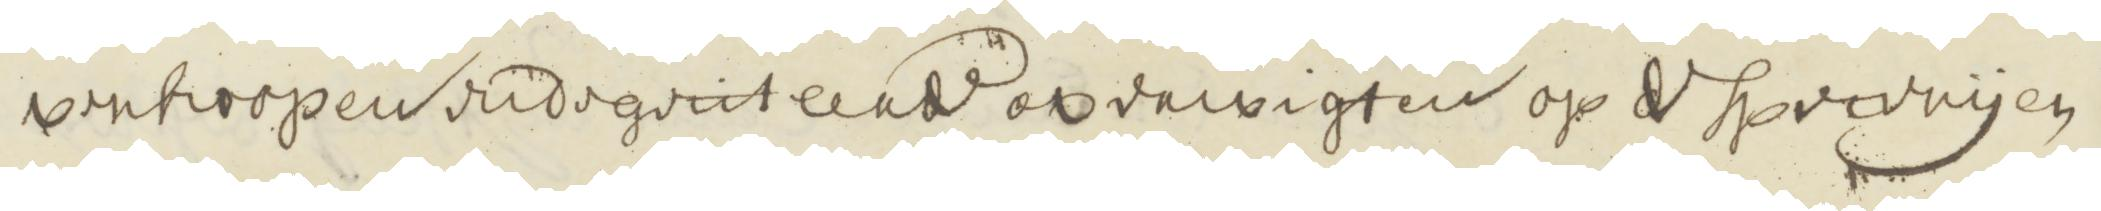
verkoopen en de geciteerde overwigten op de specerijen
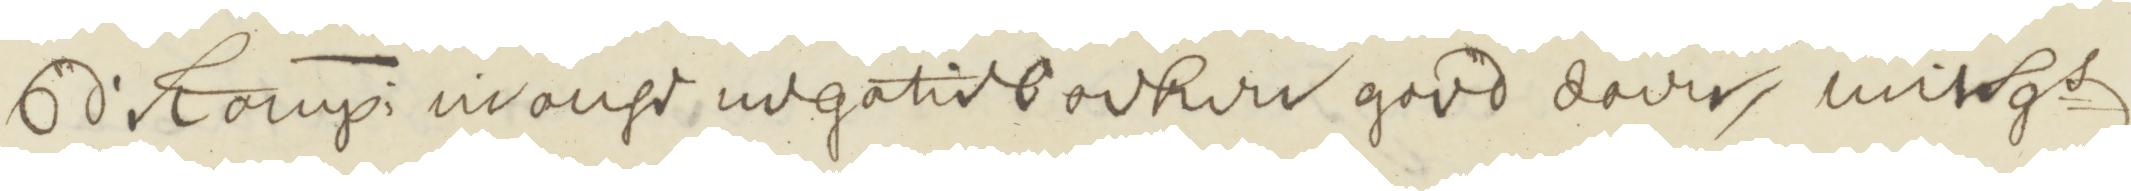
d’E Comp: in onse negotieboeken goed doen, mitsg=s
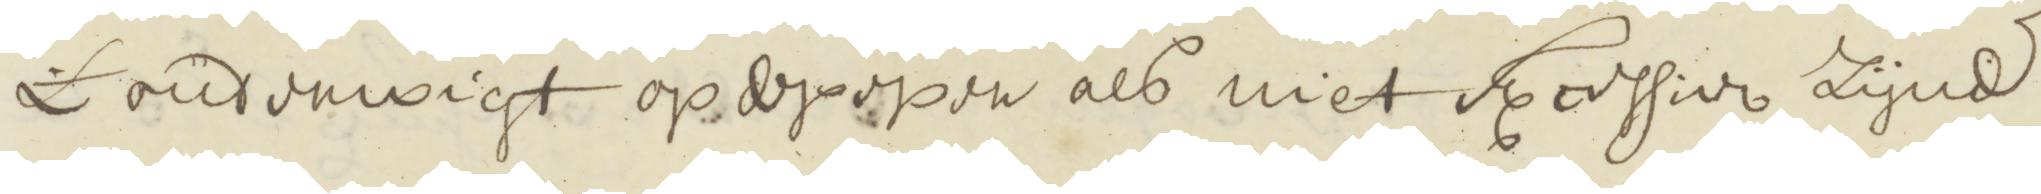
't onderwigt op de peper als niet Excessiev zijnde
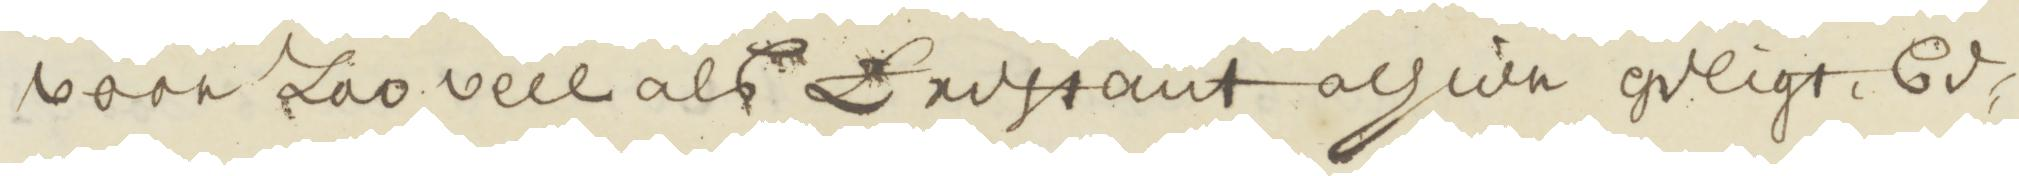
voor zoo veel als t restant alhier geligt, be„
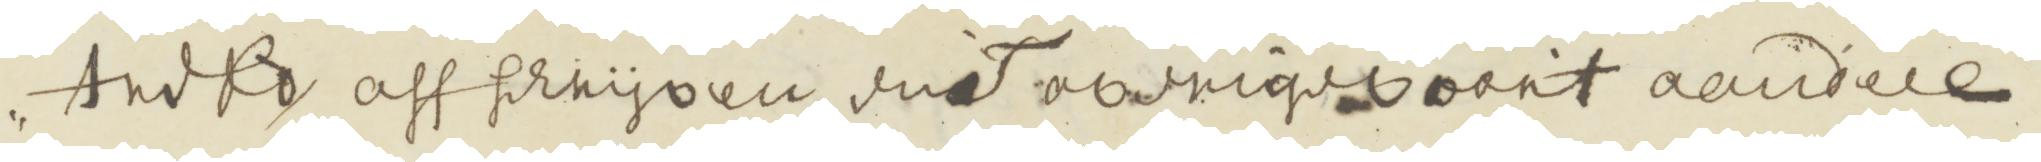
„trefd, aff schrijven, en 't overige voor't aandeel
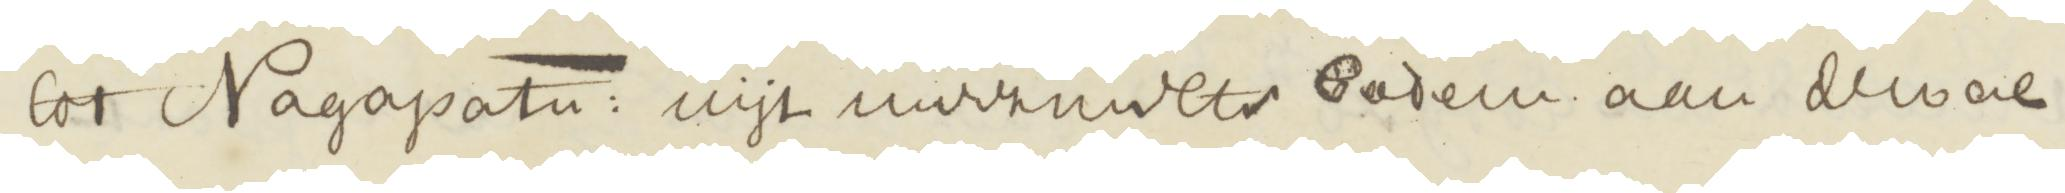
tot Nagapatn: uijt meermelte bodem aan dewal
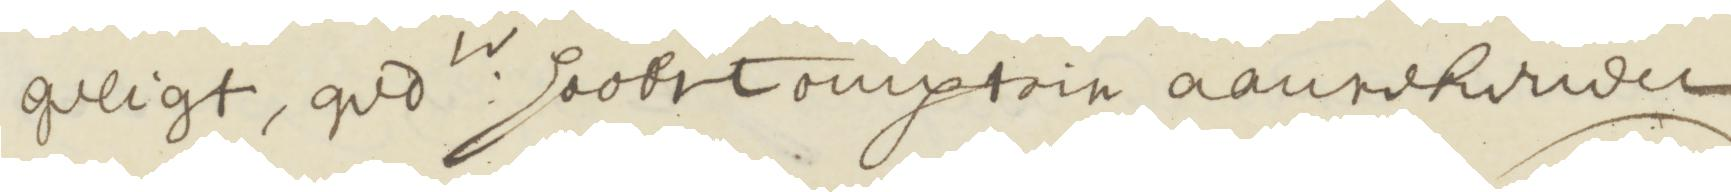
geligt, ged:te hooftcomptoir aanrekenen
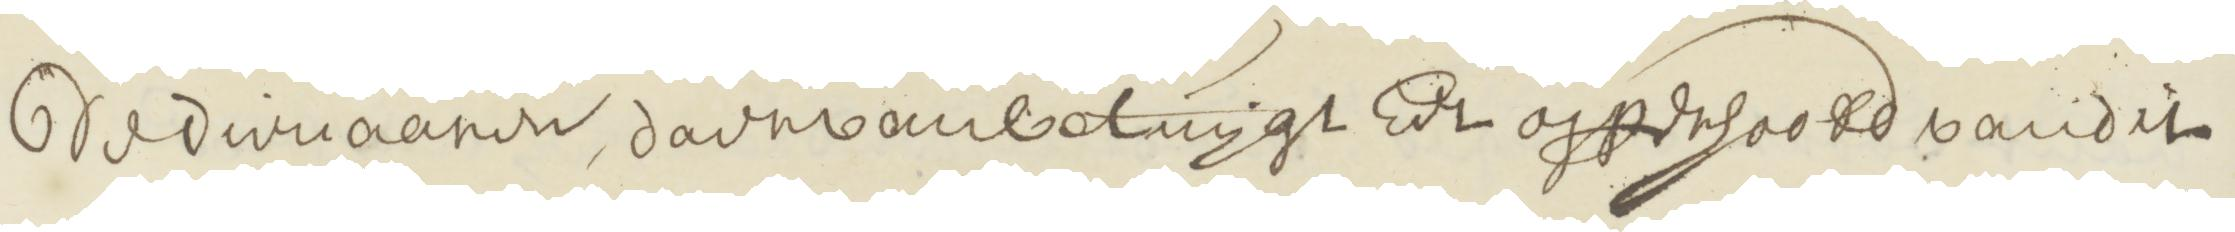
de dienaaren, daervan betuijgt het opperhoofd van dit
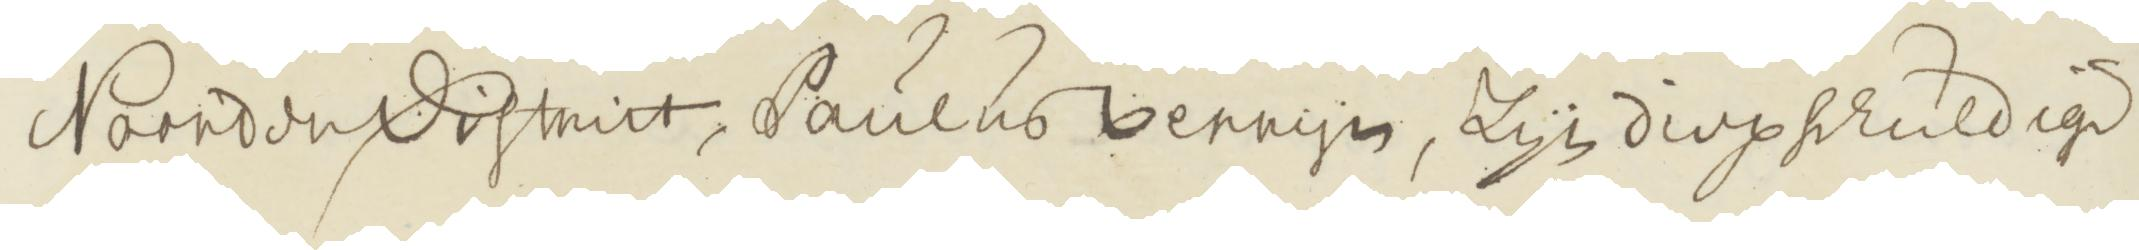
Noorder District, Paulus verrijn, zijt diep schuldige
